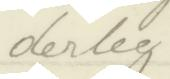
derteg
